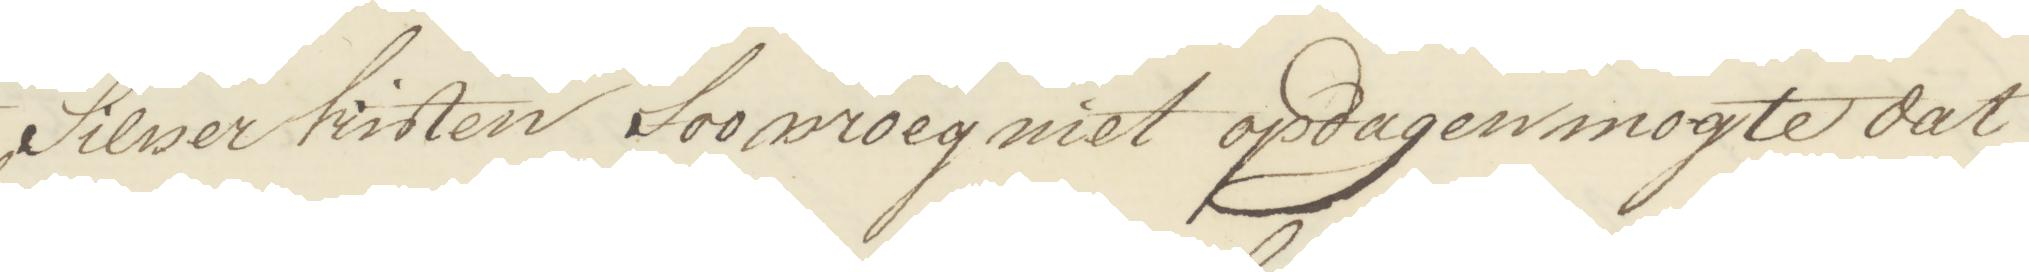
silver kisten soo vroeg niet opdagen mogte dat
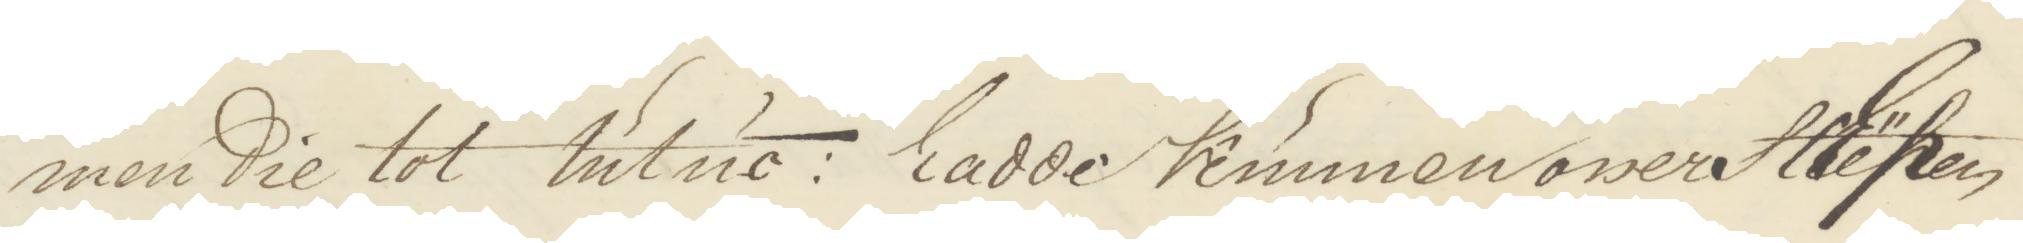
men die tot tutuc: hadde kunnen overstEeken
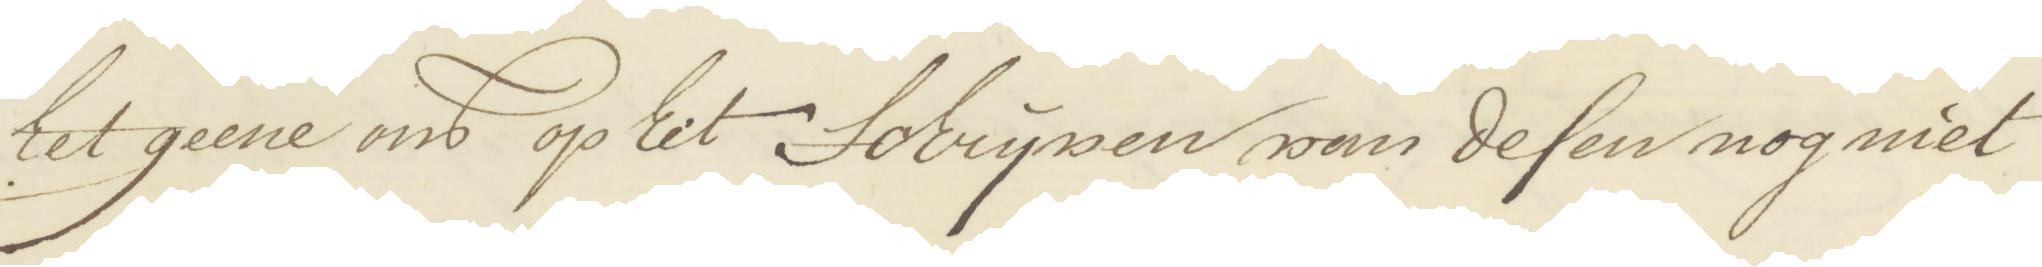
het geene ons op het schrijven van desen nog niet
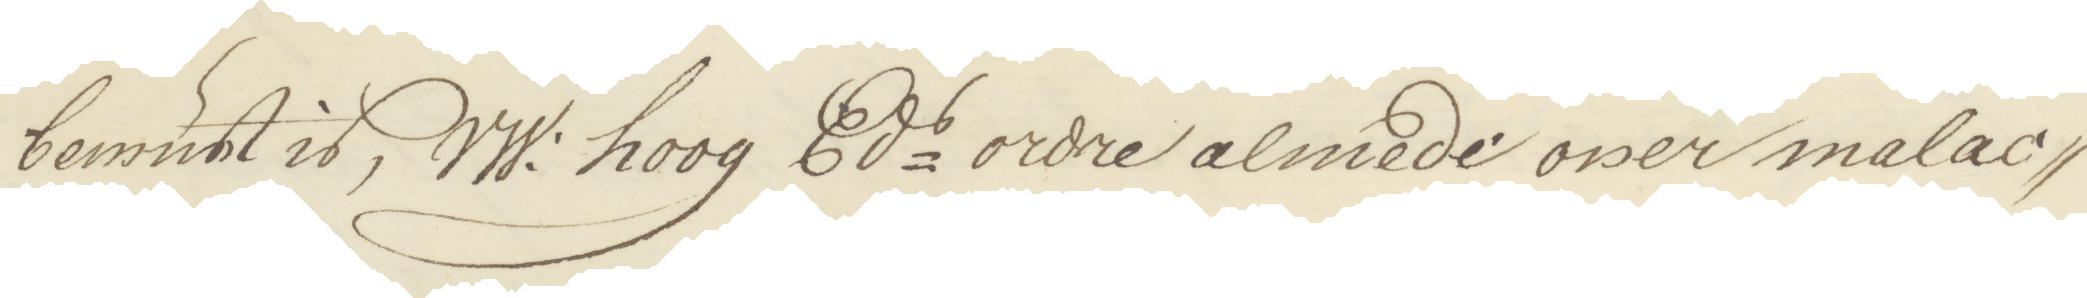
bewust is, VW: hoog Ed=s ordre almede over malac„
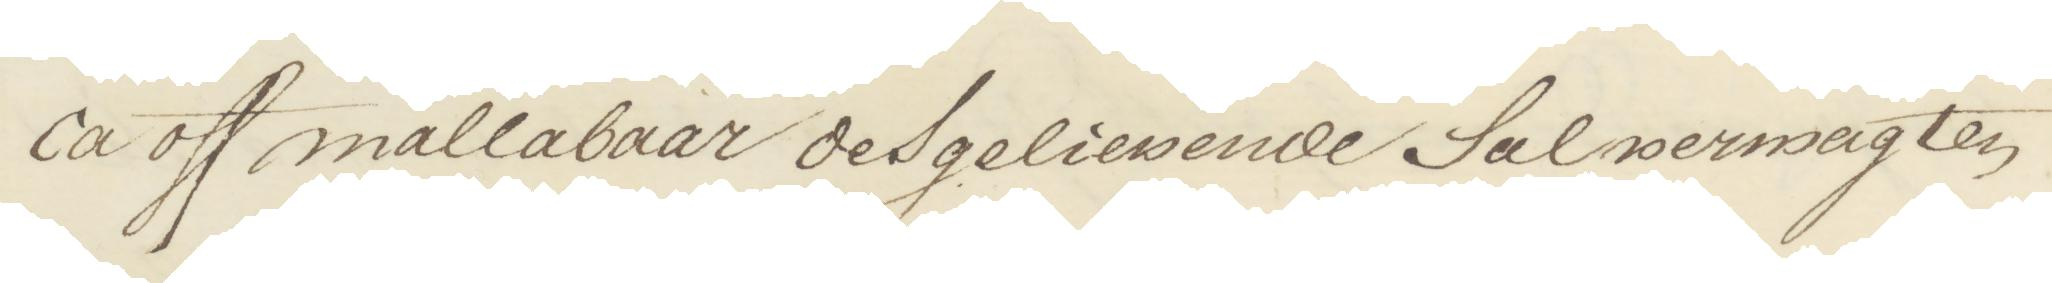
ca off mallabaar desgelievende sal verwagten
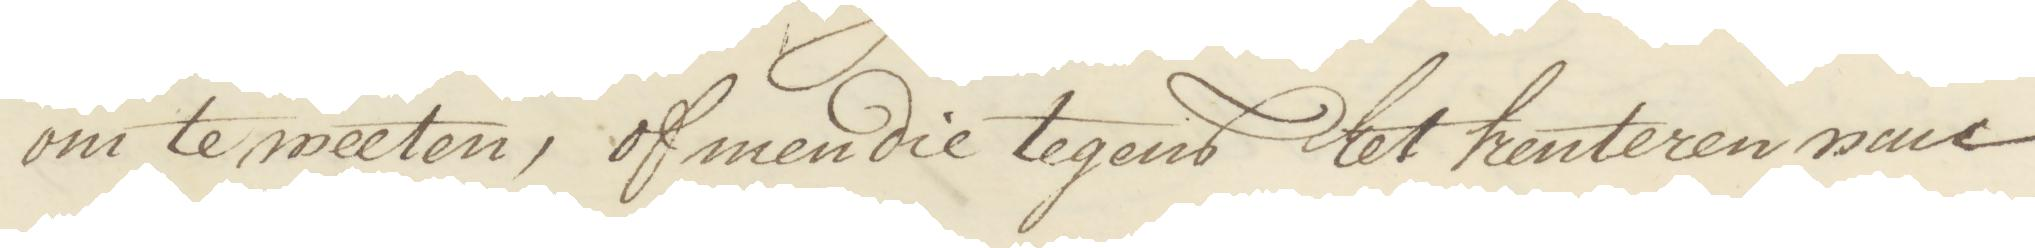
om te weeten, of men die tegens het kenteren van
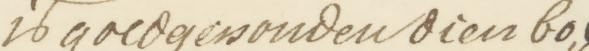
is goedgevonden dien bo„
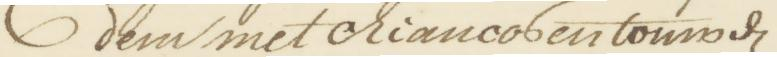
dem met chiancosen touwen
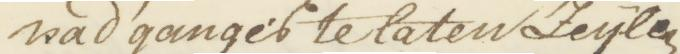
na d' ganges te laten zeijlen
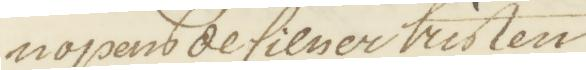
nopens de silver kisten
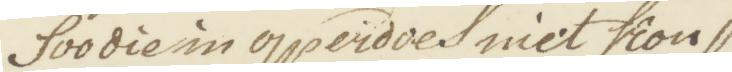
soo die in opperdoes niet kon„
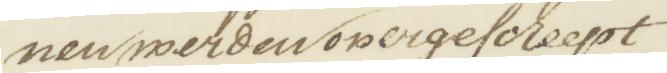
nen werden overgescheept
